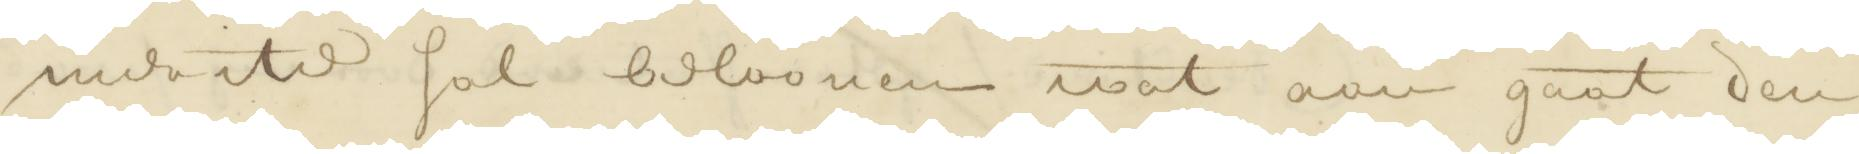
merite sal beloonen wat aan gaat den
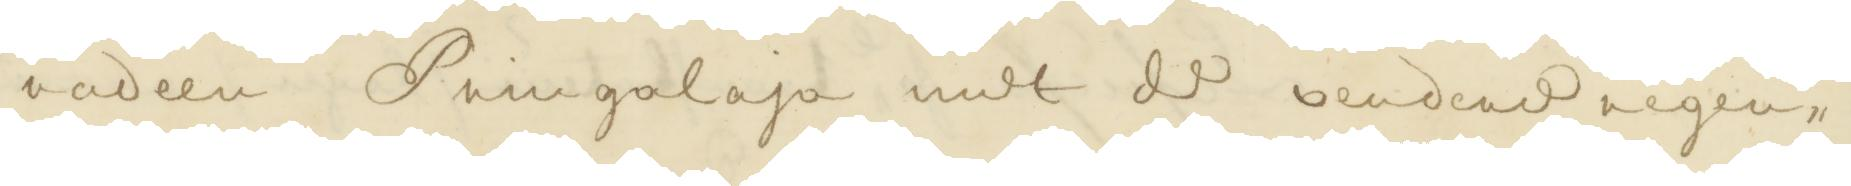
radeen Pringalaja met de verdere regen„
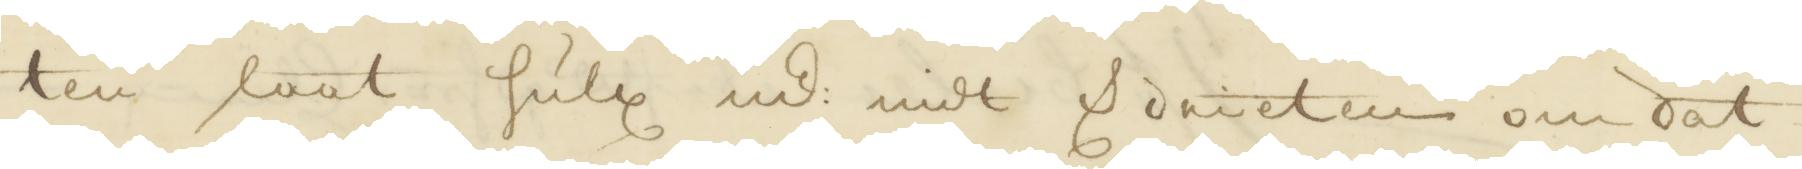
ten laat sulx ue: niet verdrieten om dat
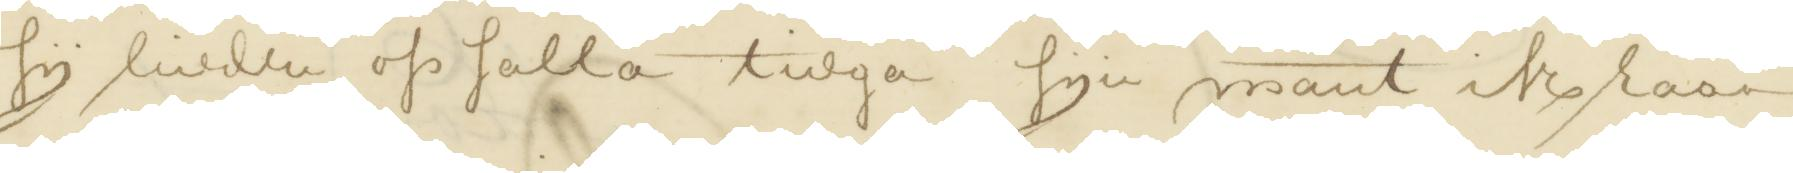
sij lieden op salla tiega sijn want ik haar
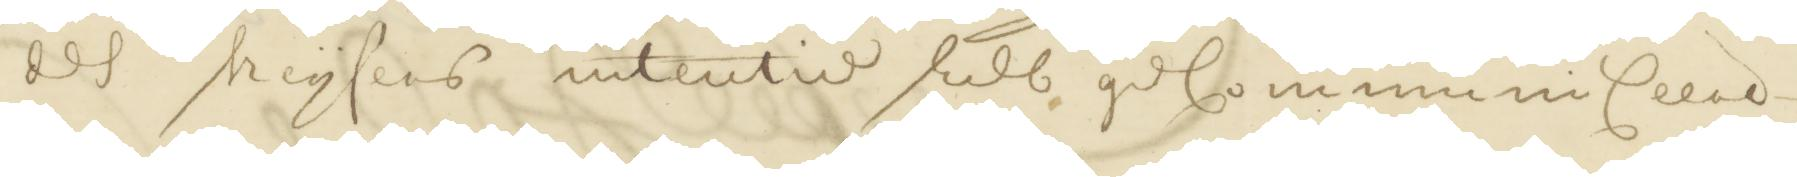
des keijsers intentie heb gecommuniceerd
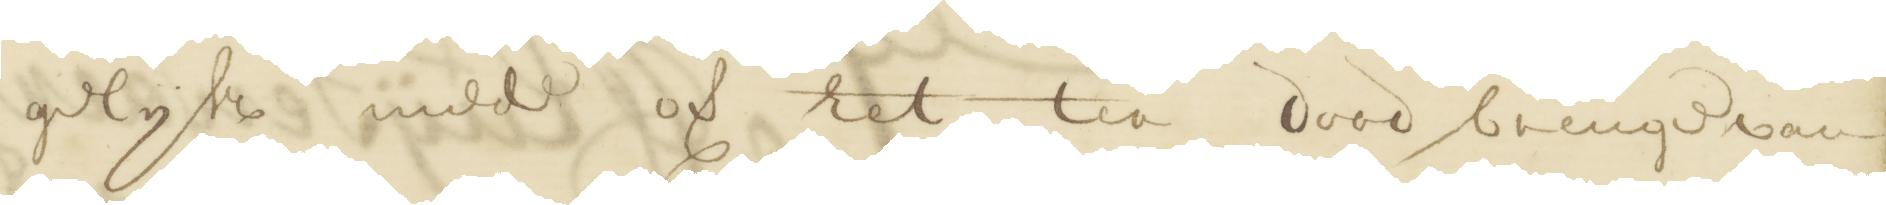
gelijk mede over het ter dood brenge van
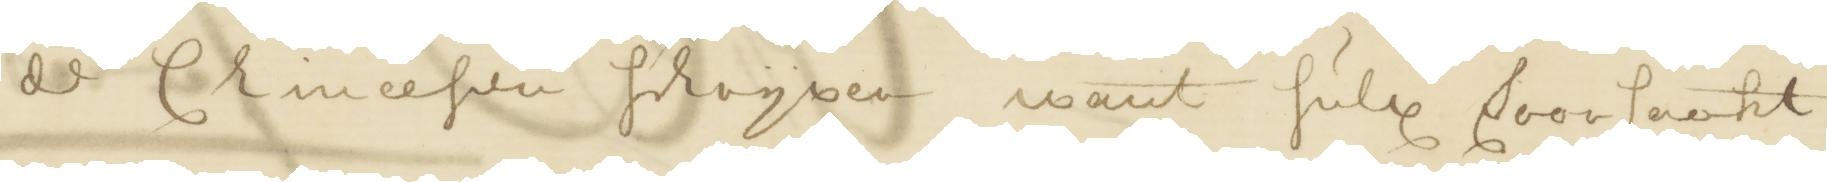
de Chineesen schrijver want sulx veroorsaekt
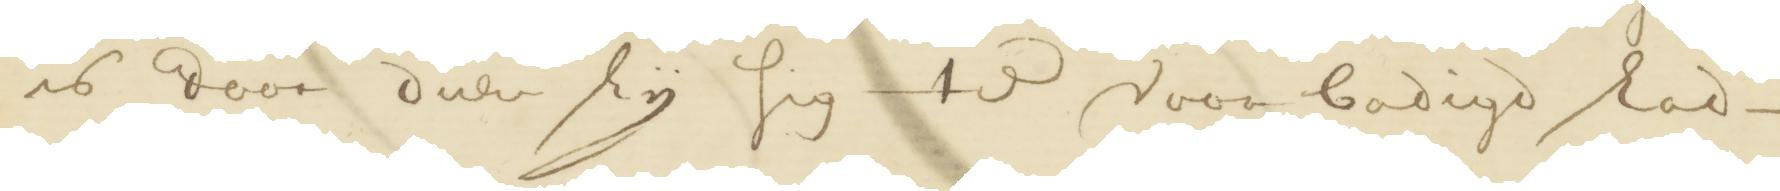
is door dien hij sig te voor bodigd had
